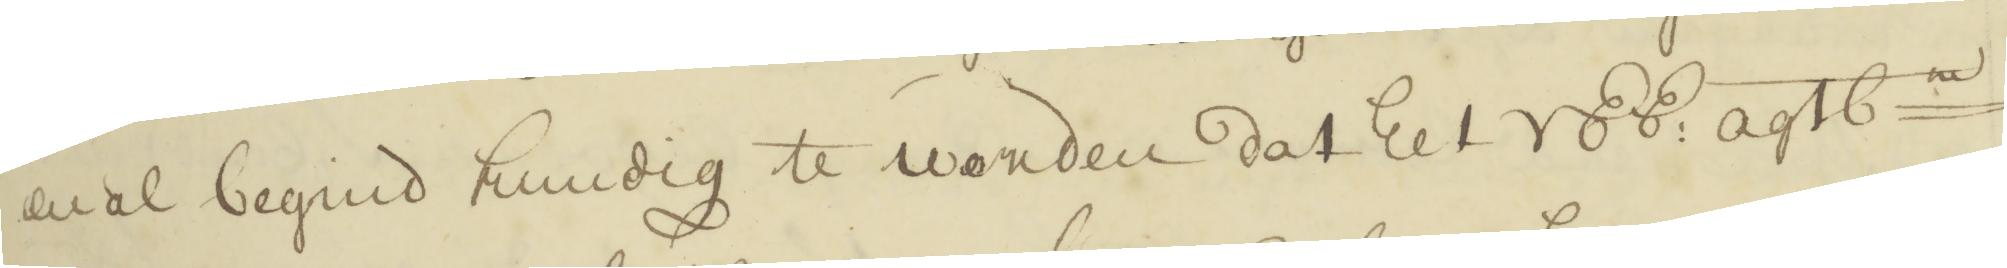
en al begind kundig te worden dat het uEE: agtb=re
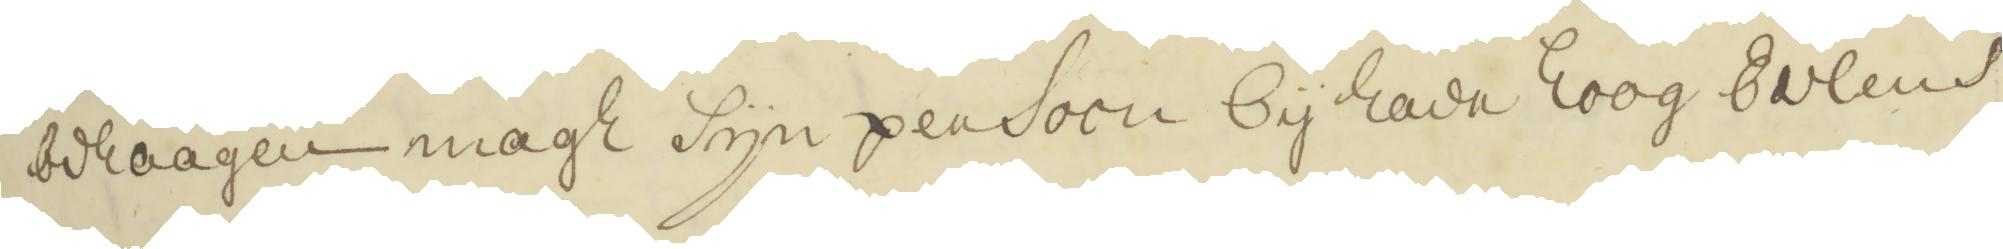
behaagen magh sijn persoon bij haer hoog Edelens
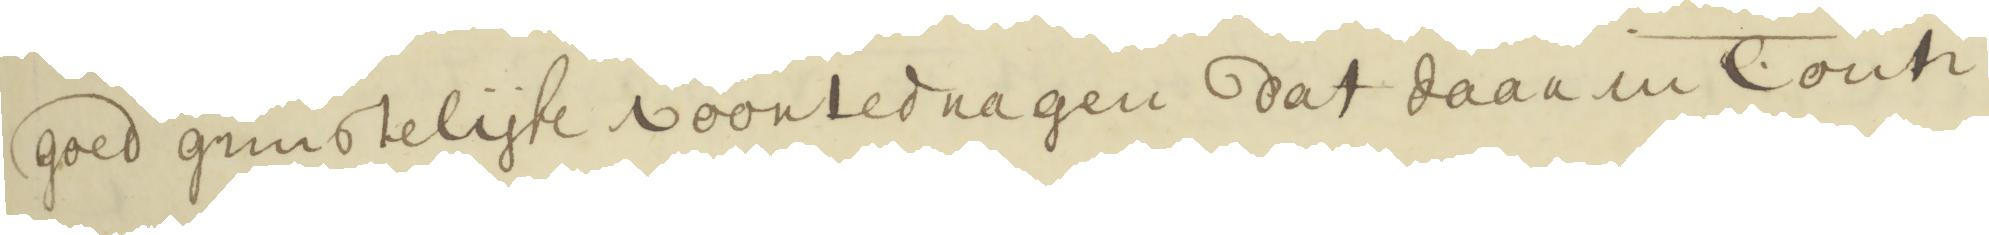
goed gunstelijk voortedragen dat daar in Conti
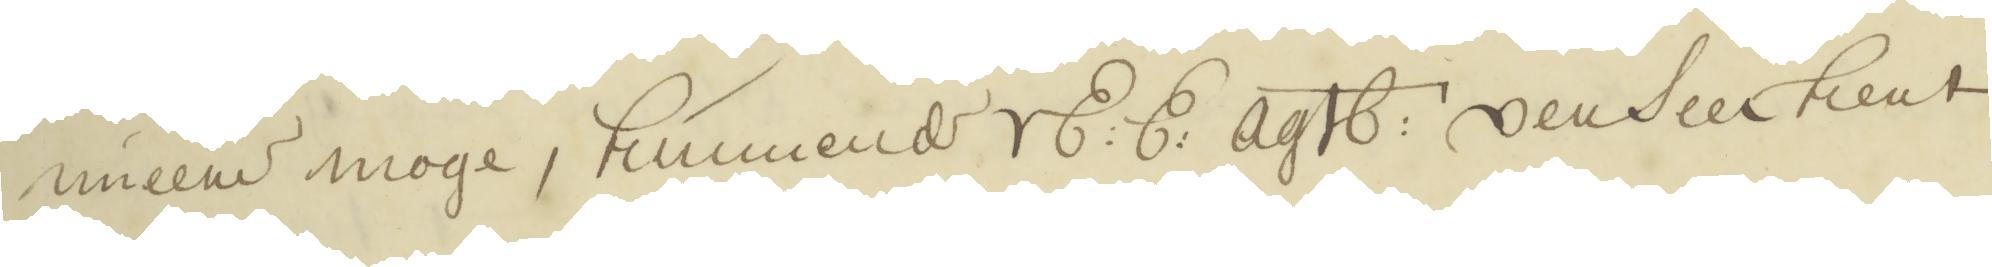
nueere moge, kunnen de uE: E: agtb: verseeckert
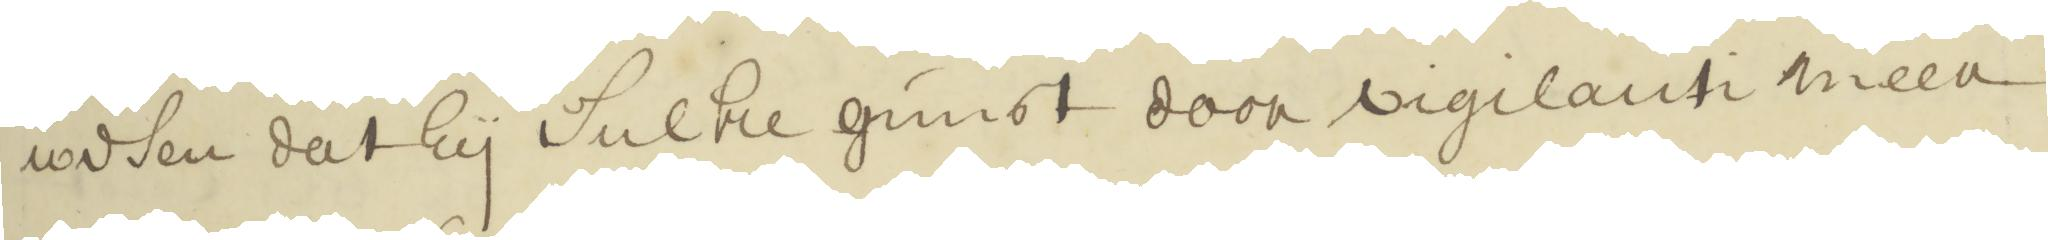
wesen dat hij sulke gunst door vigilanti meer
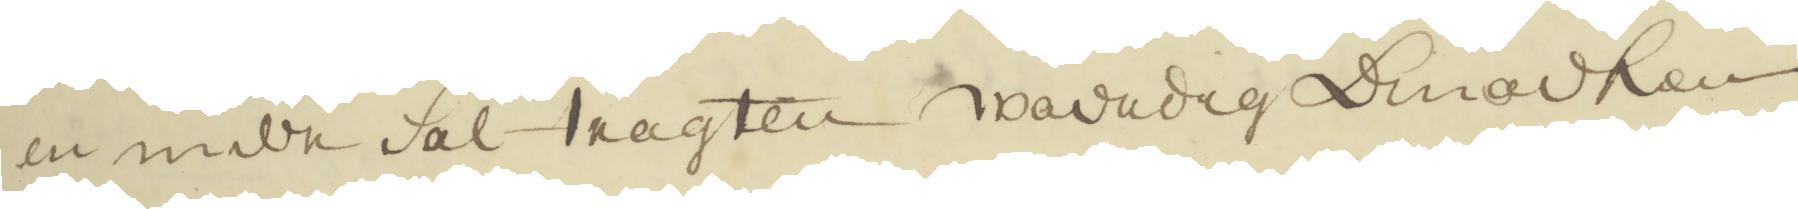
en meer sal tragten waerdig temaeken.
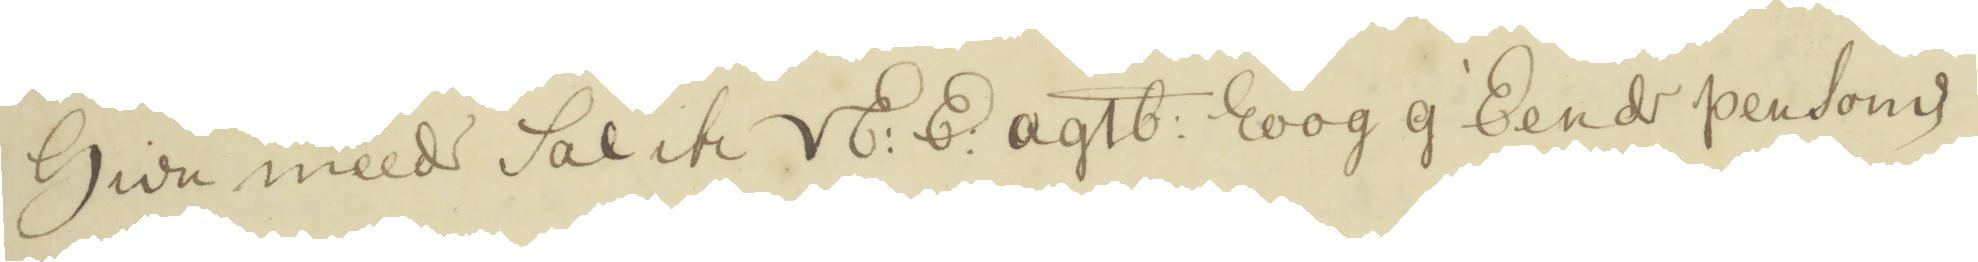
Hier meede sal ik uE: E: agtb: hoog g’Een de personen
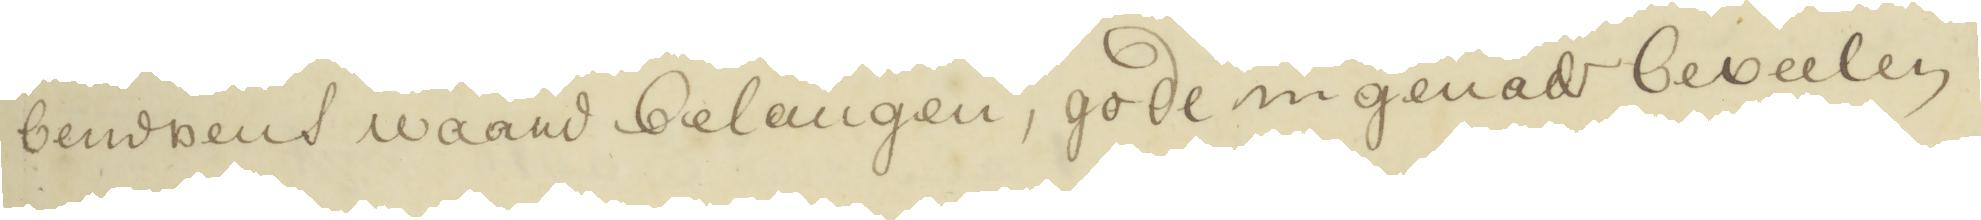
benevens waare belangen, gode in genade beveelen
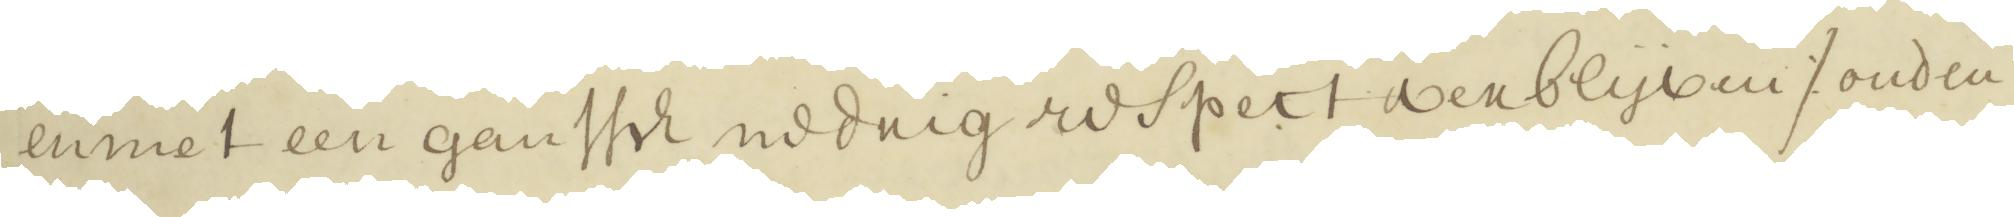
en met een ganssch nedrig respect verblijven /onder
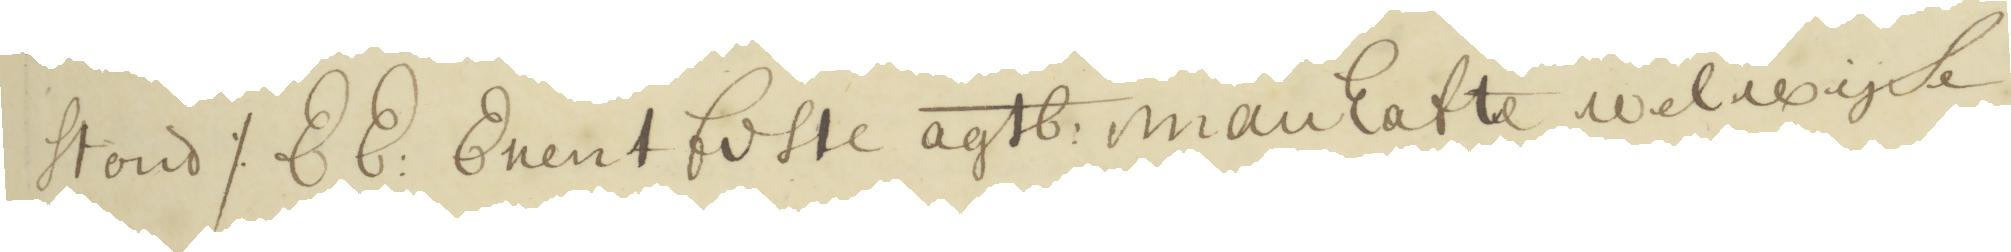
stond/ E E: Erentfeste agtb: manhafte wel wijse
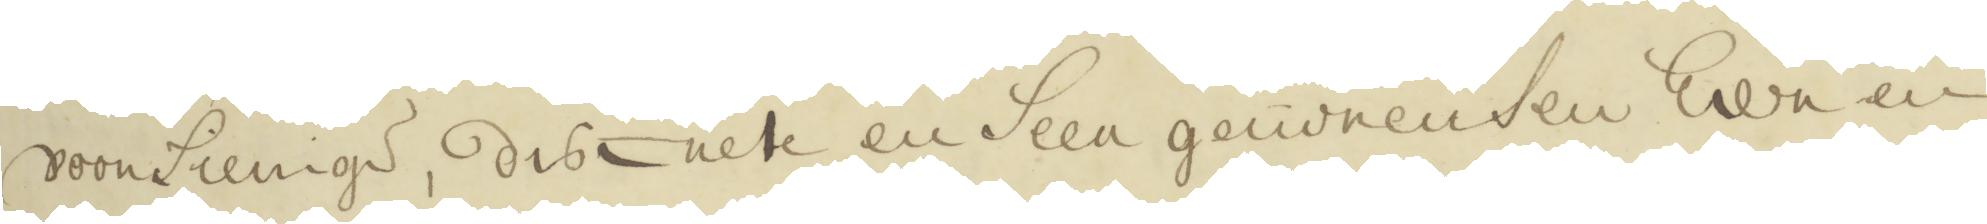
voorsienige, discrete en seer genereusen heer en
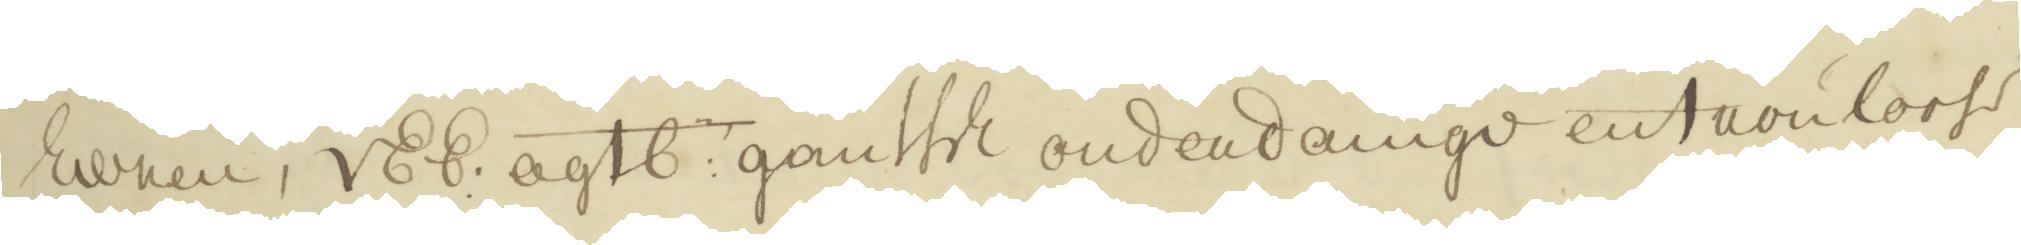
heeren, uE E: agtb: ganssch onderdanige entrouloose
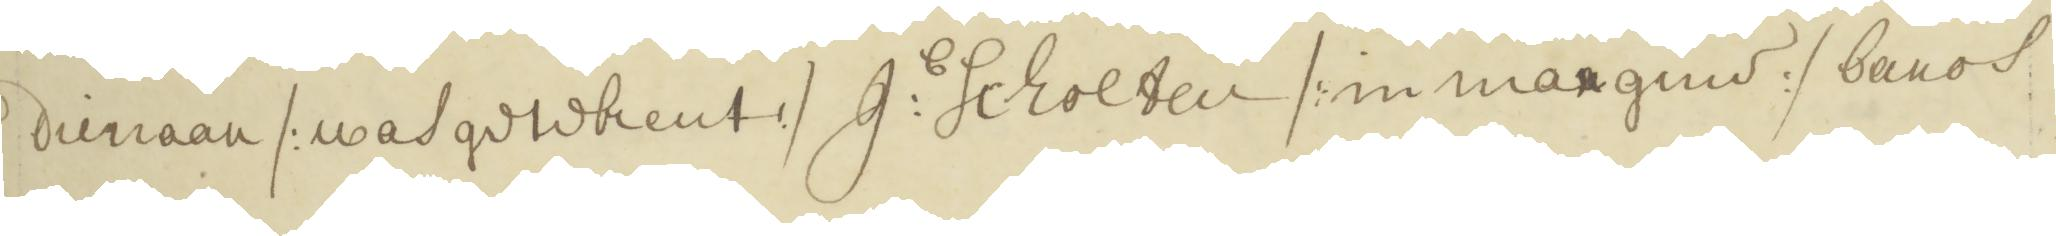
dienaar /:was getekent:/ G:b Scholten /:in margine:/ baros
